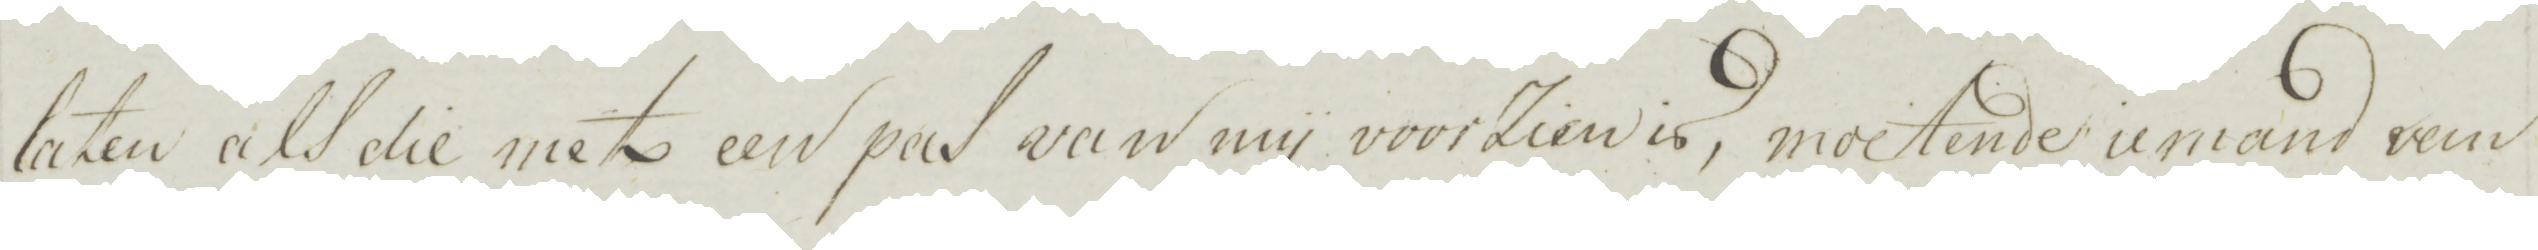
laten als die met een pas van mij voorzien is, moetende iemand van
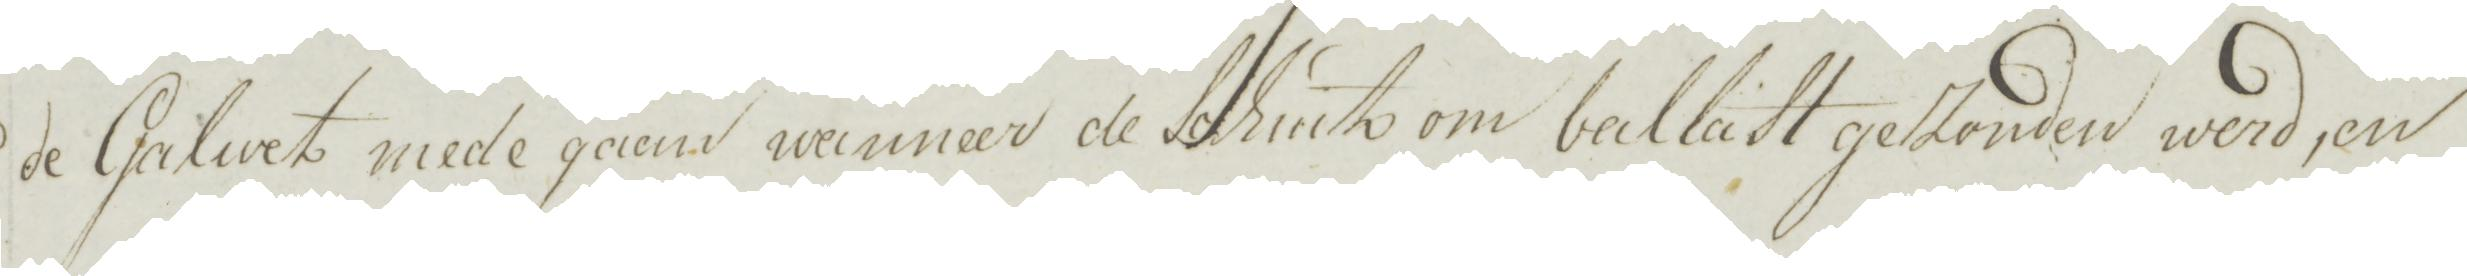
de Galwet mede gaan wanneer de Schuit om ballast gezonden werd, en
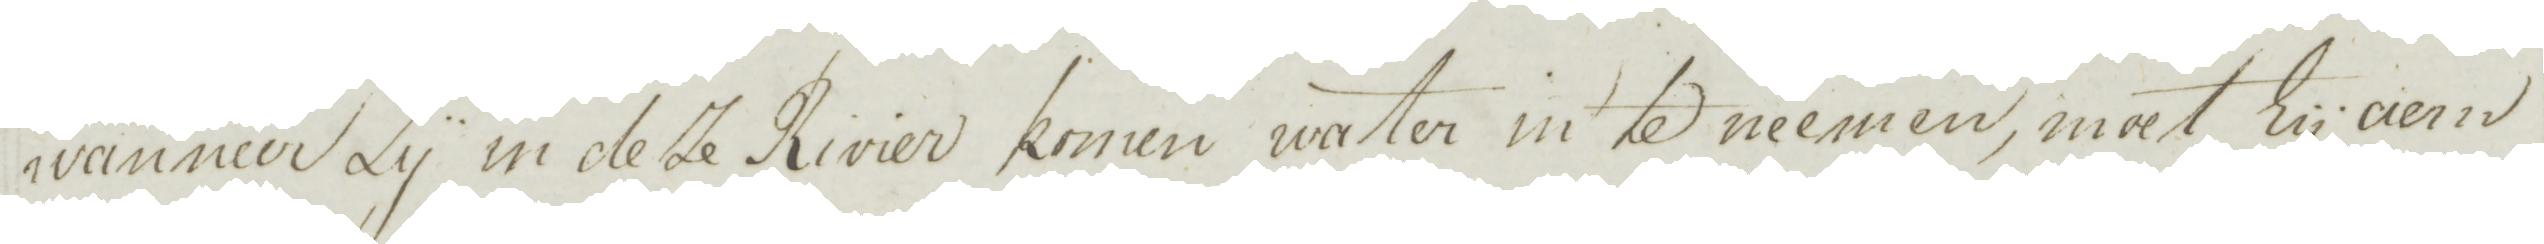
wanneer Zij in deze Rivier komen water in te neemen, moet hij aan
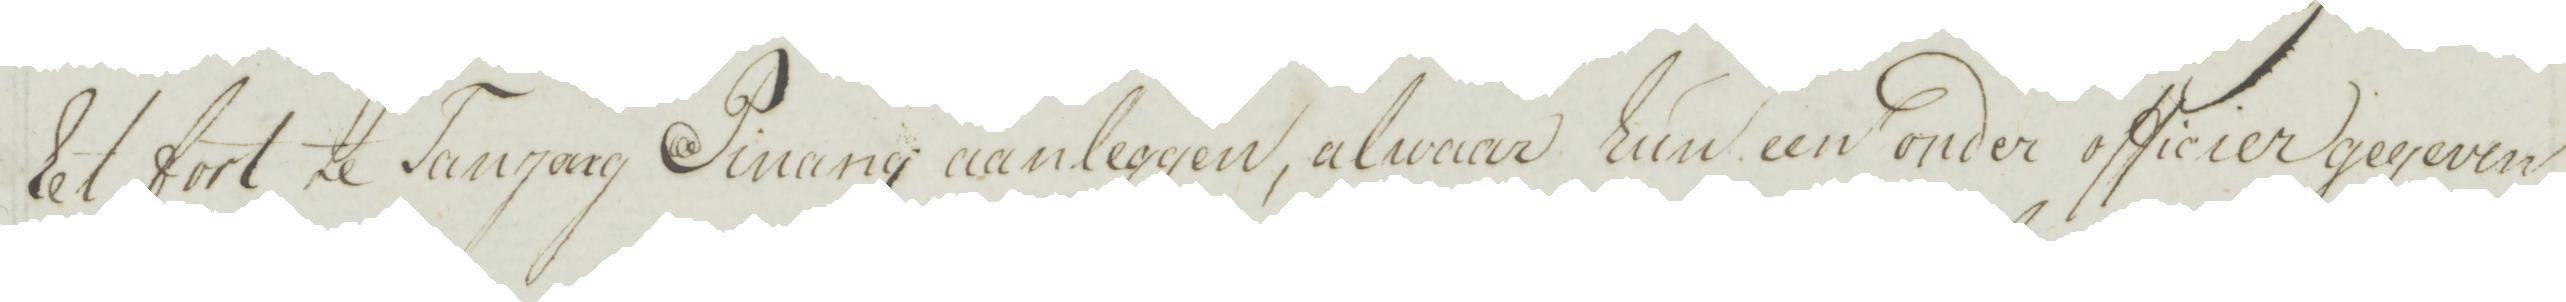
het fort te Tanjong Pinang aanleggen, alwaar hun een onder officier gegeven
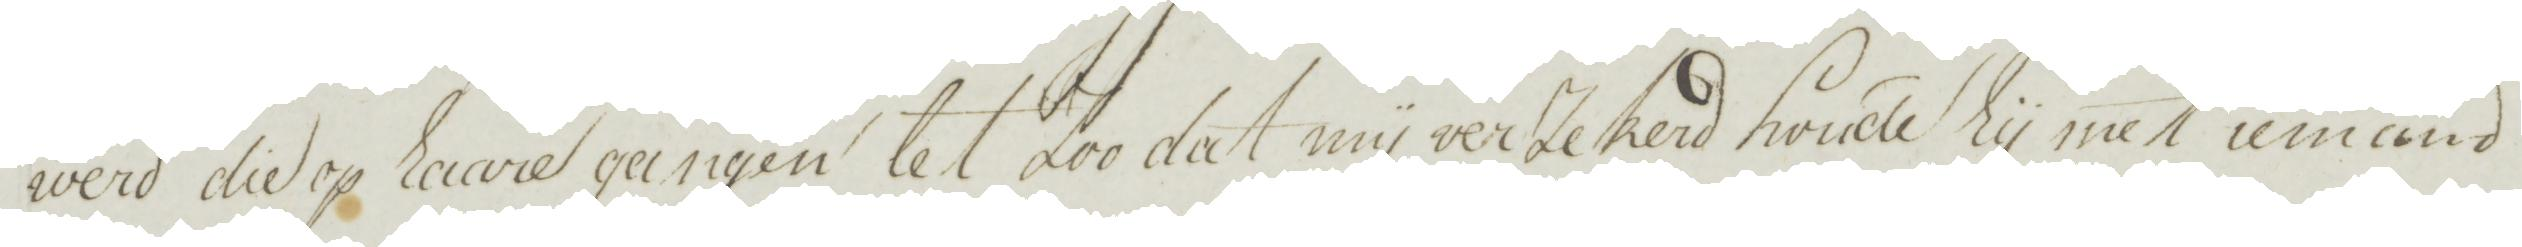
werd die op haare gangen let Zoo dat mij verzekerd houde hij met iemand
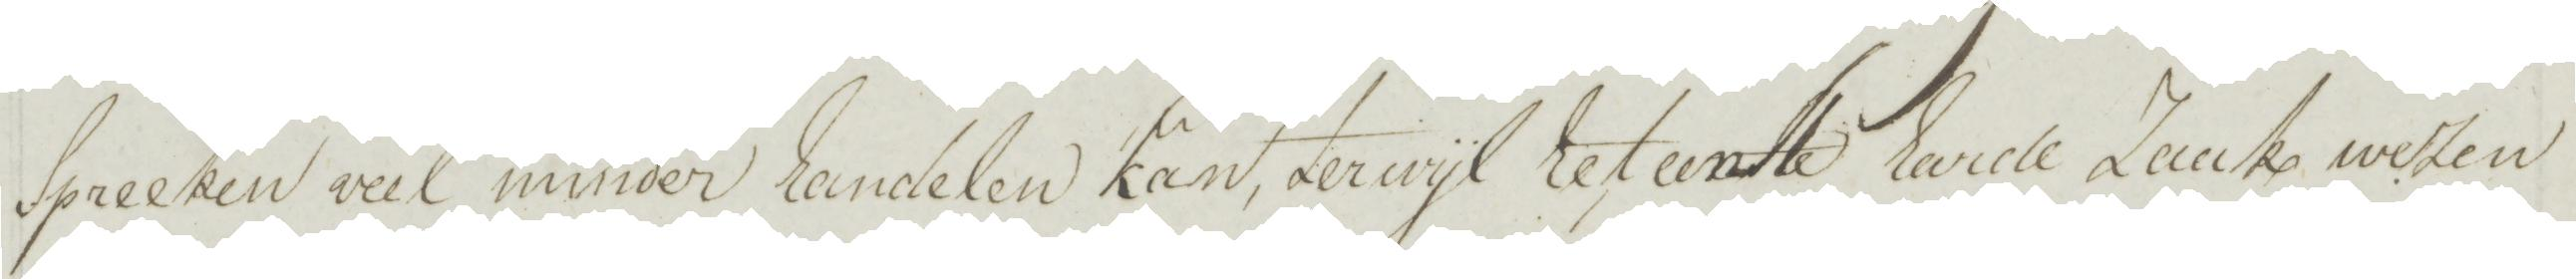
Spreeken veel minder handelen kan, terwijl het eens te harde Zaak wezen
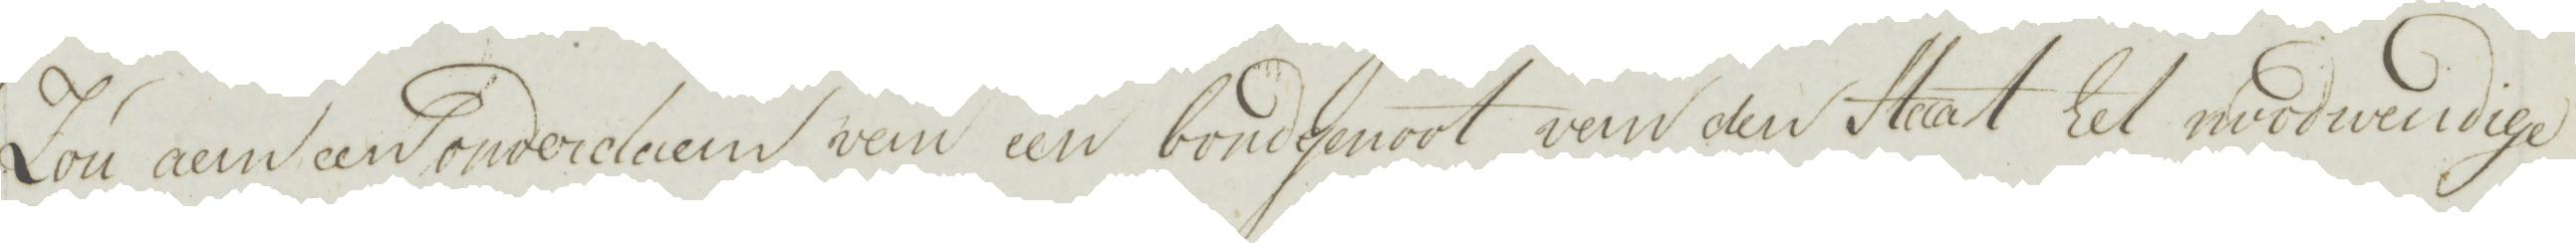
Zou aan een onderdaan van een bondgenoot van den Staat het noodwendige
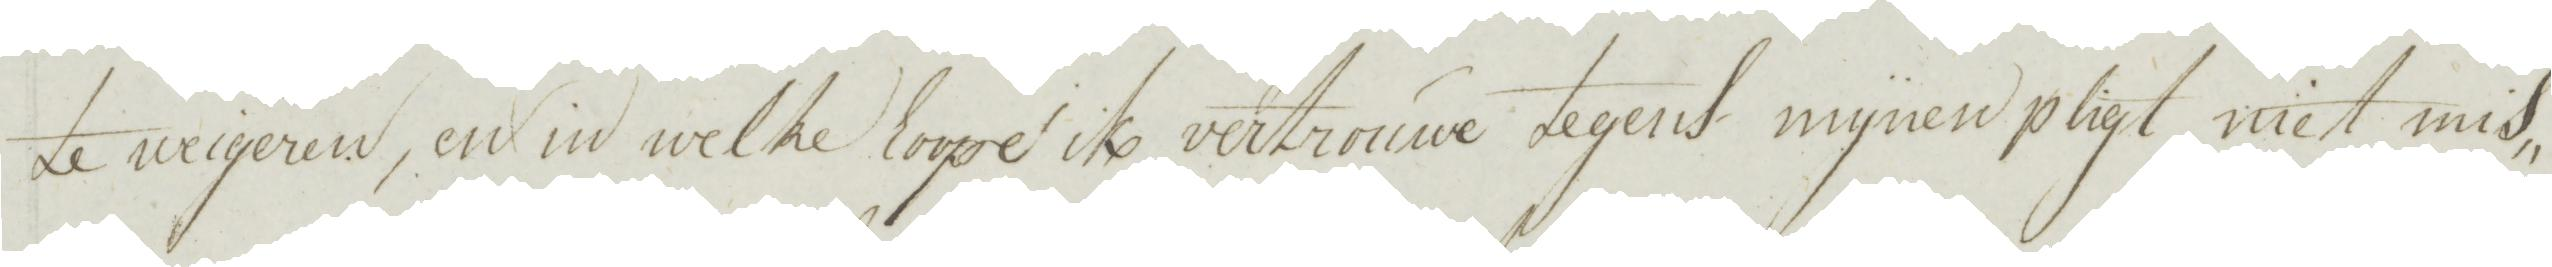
te weigeren, en in welke hoope ik vertrouwe tegens mijnen pligt niet mis„
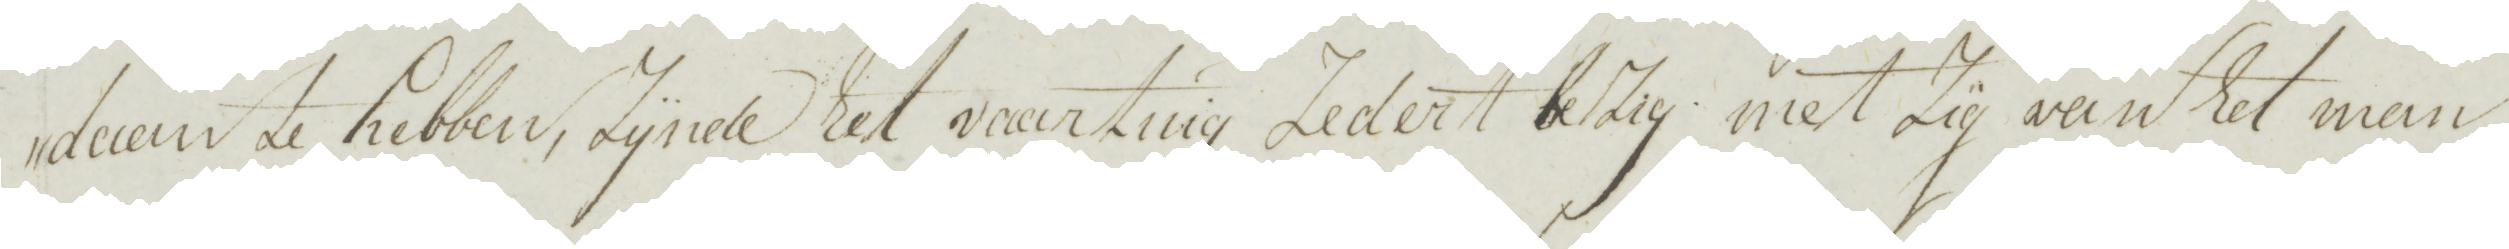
„daan te hebben, Zijnde het vaartuig Zedert bezig met Zig van het man
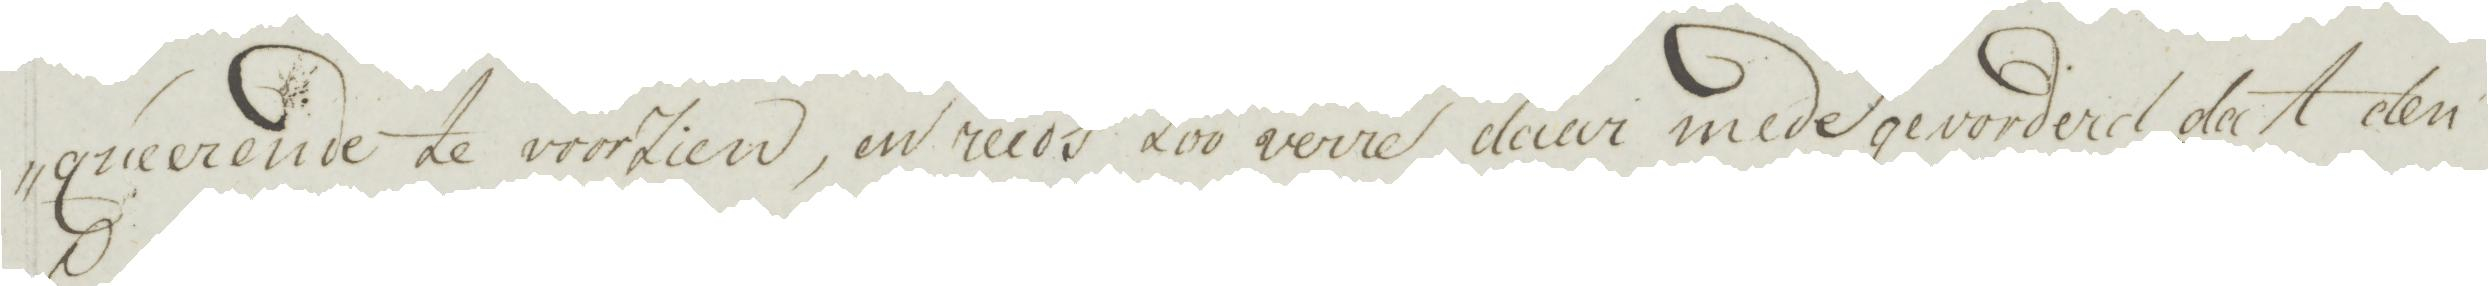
„queerende te voorzien, en reeds Zoo verre daar mede gevorderd dat den
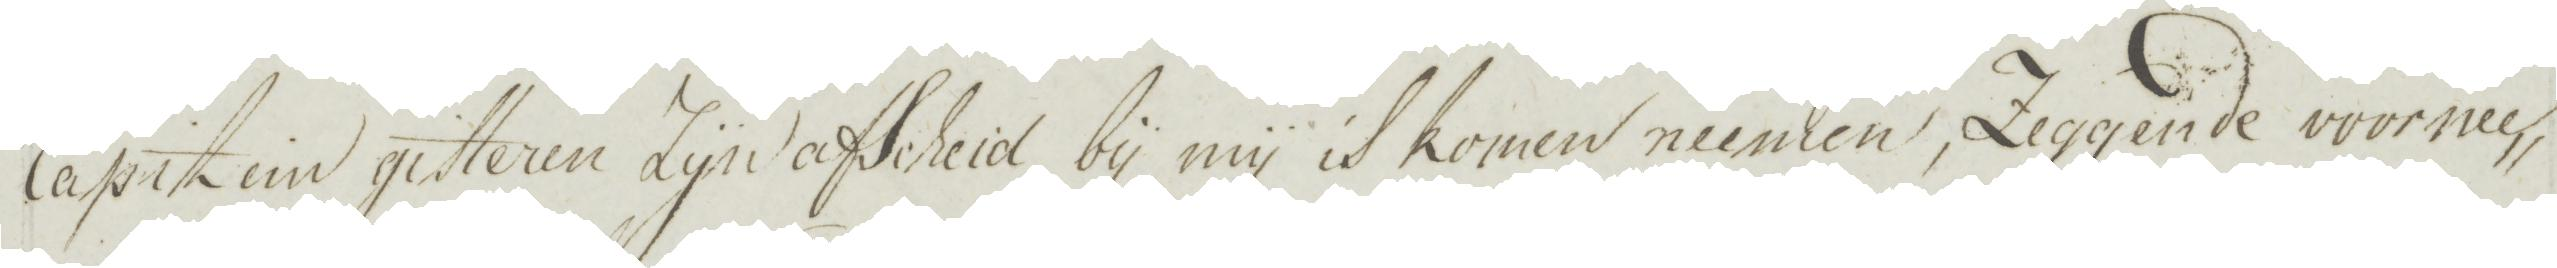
Capitein gisteren Zijn afscheid bij mij is komen neemen, Zeggende voornee„
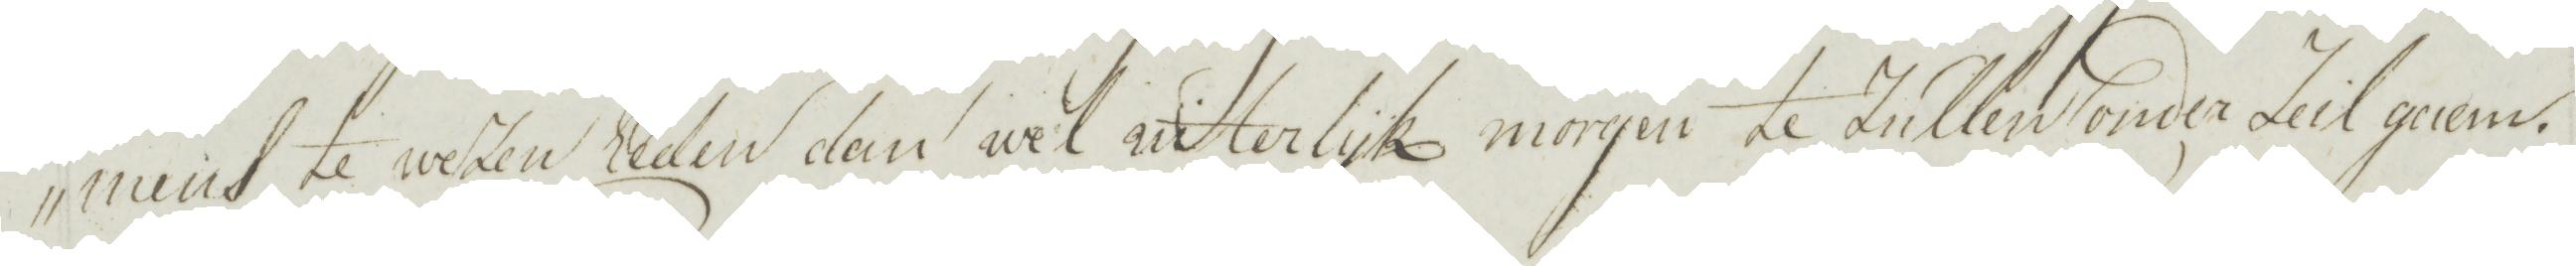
„mens te wezen heden dan wel uiterlijk morgen te Zullen onder Zeil gaan.
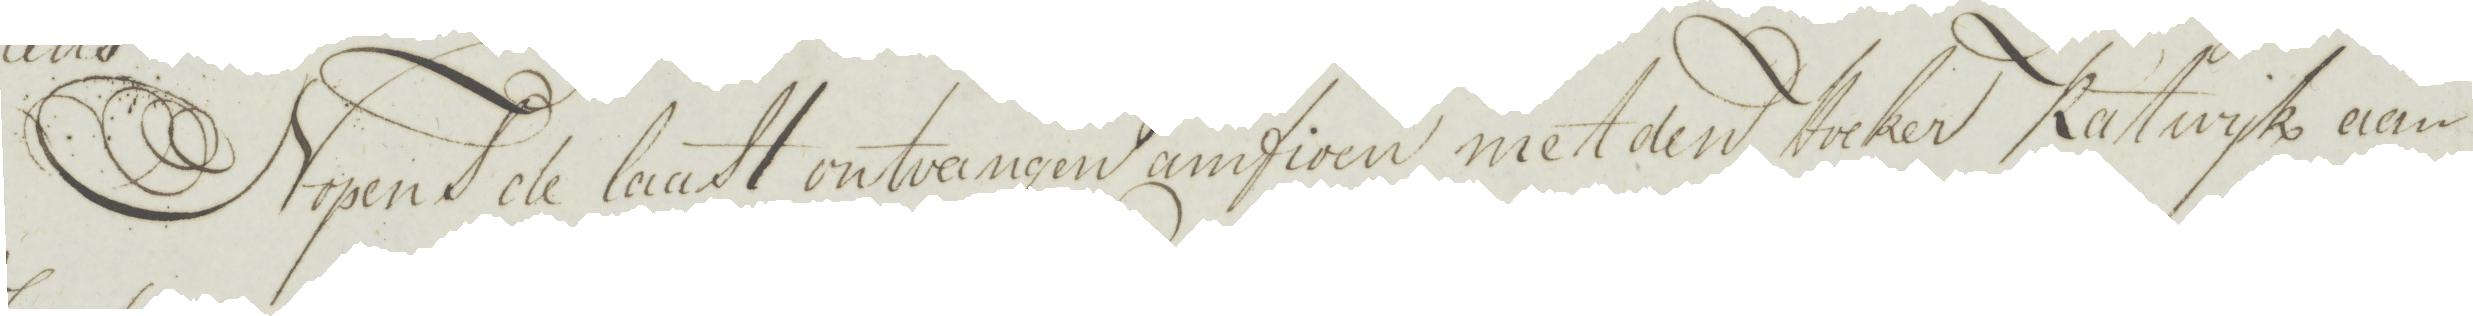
Nopens de laast ontvangen amfioen met den Hoeker Katwijk aan
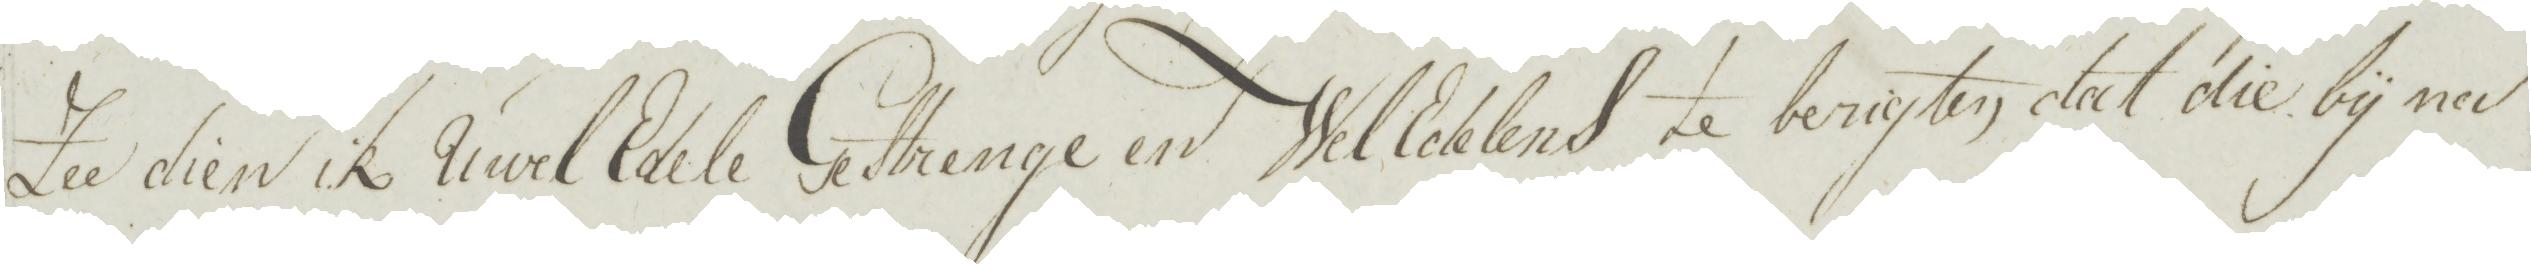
Zee dien ik uwel Edele Gestrenge en Wel Edelens te berigten dat die bij na
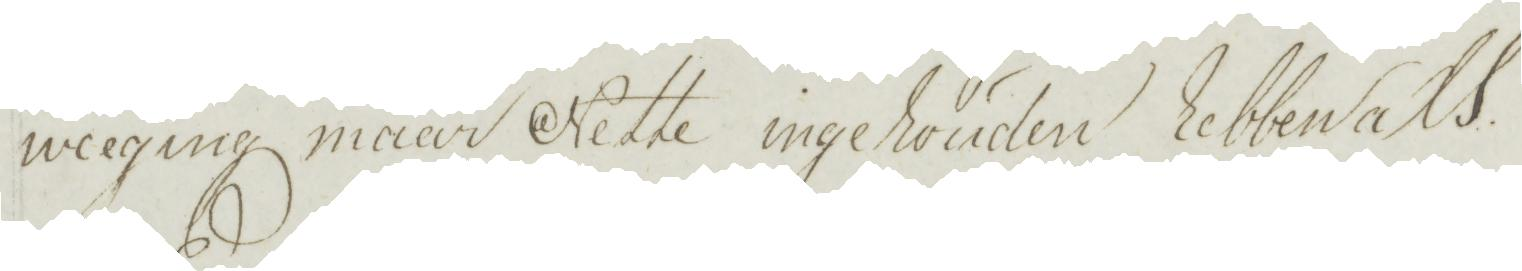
weeging maar Nette ingehouden hebben als
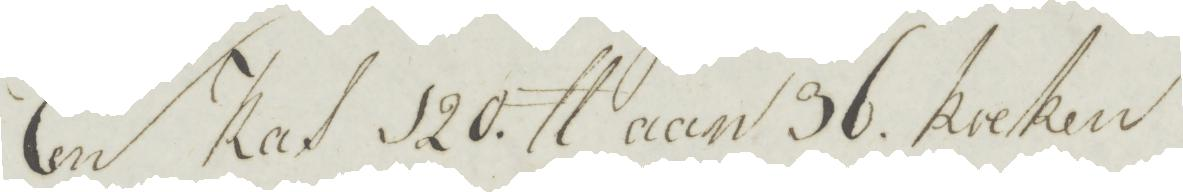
Een Kas 120: lb aan 36. koeken
